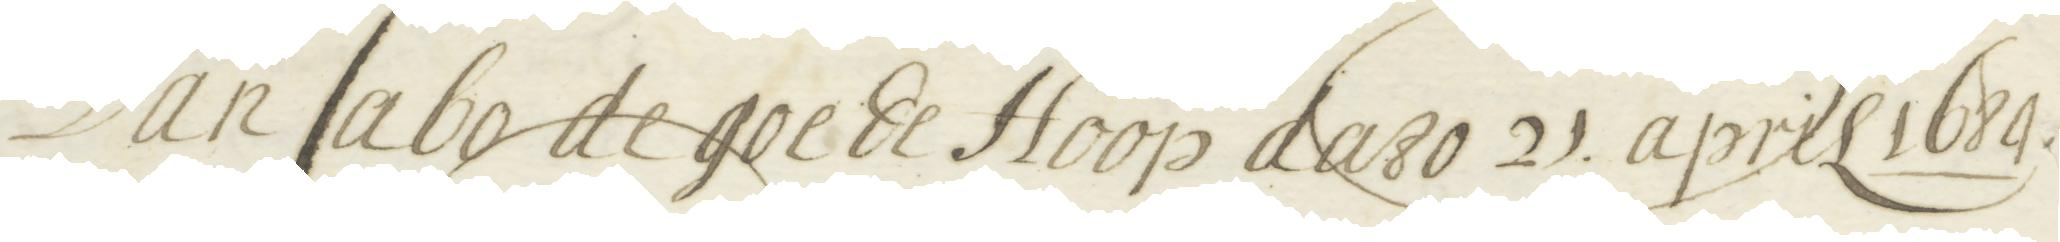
Van Cabo de goede Hoop dato 21. april 1684.
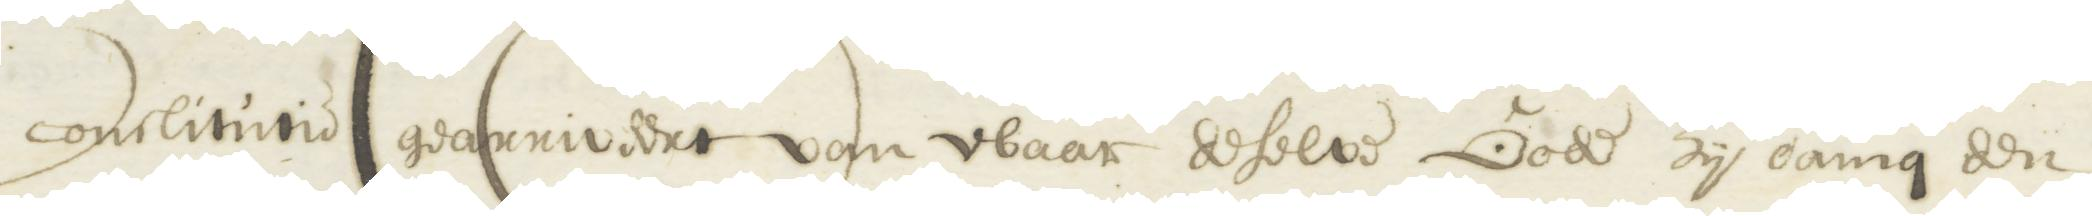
conslitutie gearriveert van waar deselve Gode zij dancq den
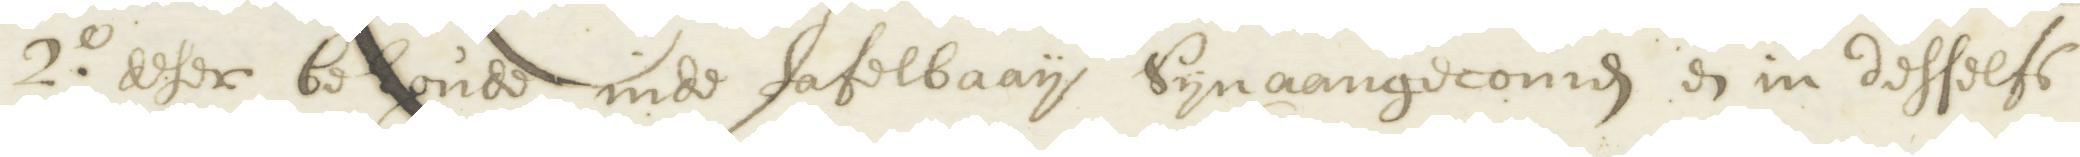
2.e deser behoude inde tafelbaaij sijn aangecomen en in desselfs
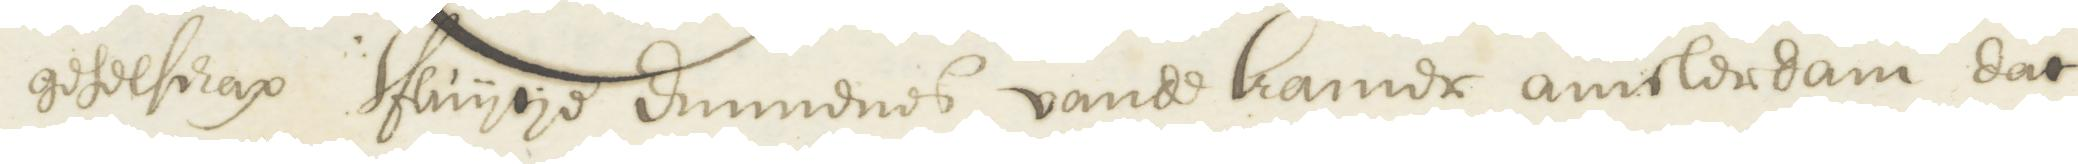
geselschap 'tfluijtje Ommenes vande kamer amsterdam dat
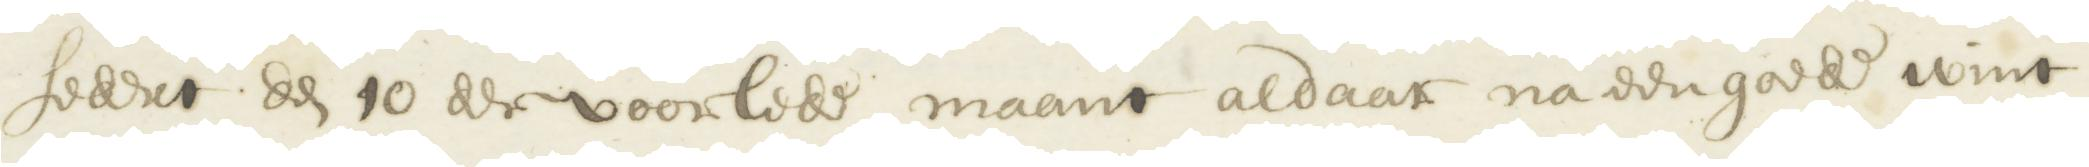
sedert den 10 der voorlede maant aldaar na een goede wint
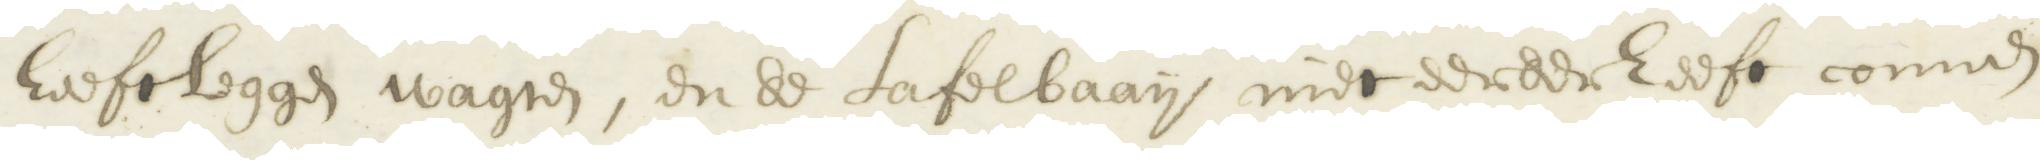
heeft leggen wagten, en de tafelbaaij niet eerder heeft connen
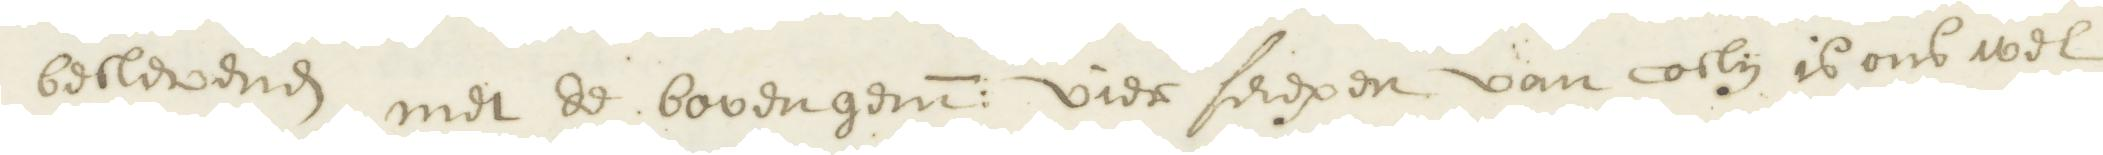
beslevenen met de bovengem: vier schepen van corbij is ons wel
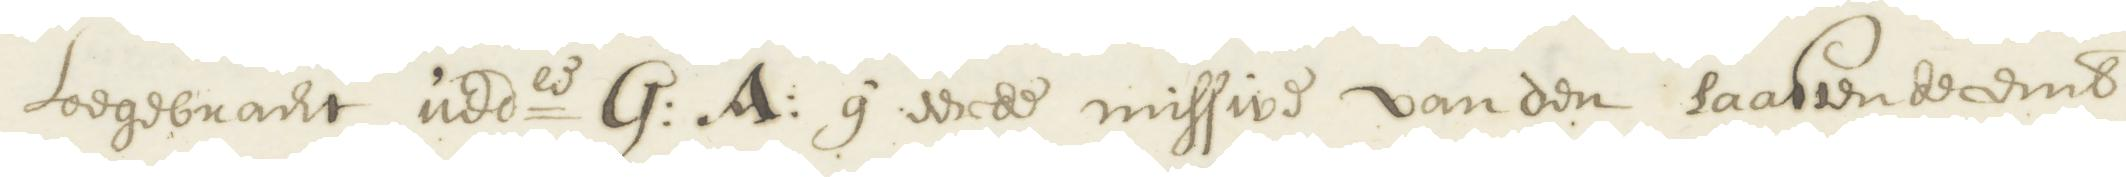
toegebracht uEd=le G: M: g’eerde missive van den laasten decemb
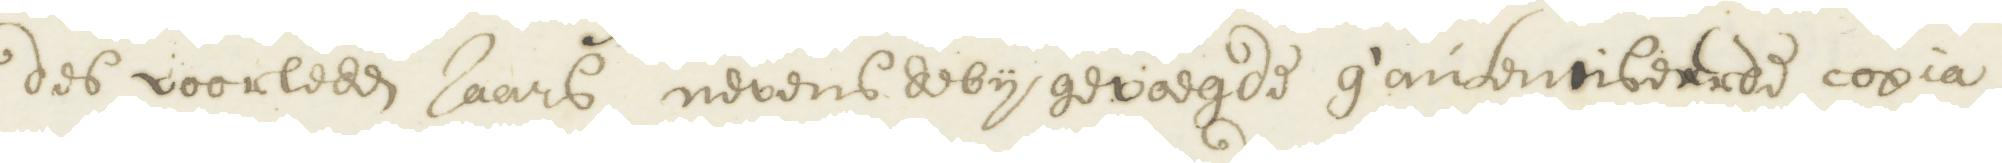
des voorleden Jaars nevens de bij gevoegde g’autentiseerde copia
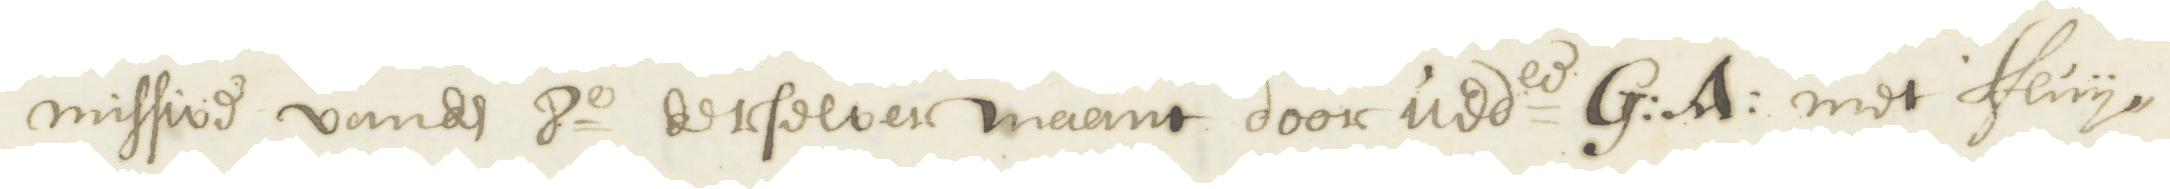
missive van den 8=e derselver maant door uEd=le G:A: met fluij
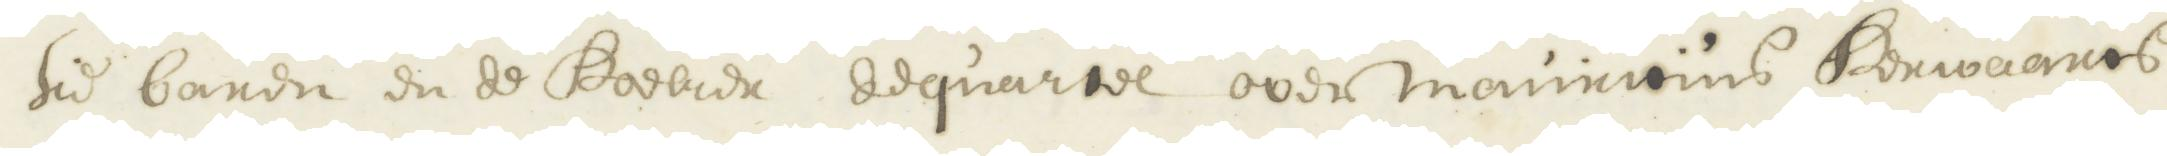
tie baren en de Boeker dequartel over maurinius Herwaarts
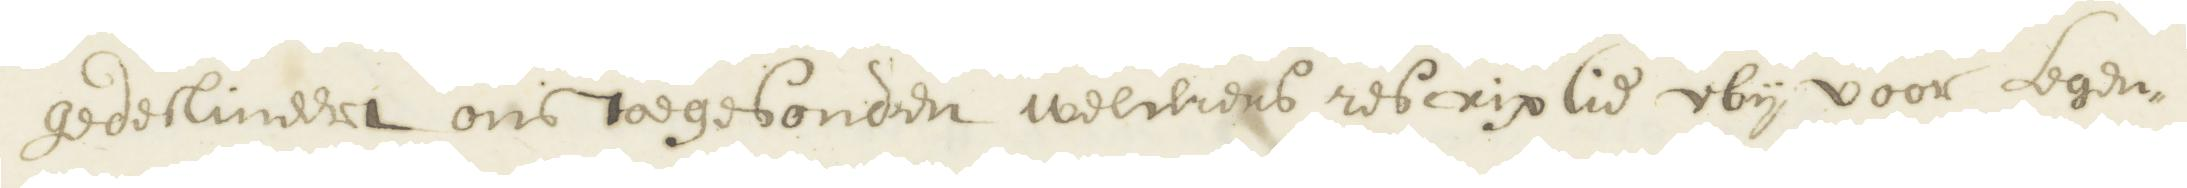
gedestineert ons toegesonden welckers rescriptie wij voor tegen„
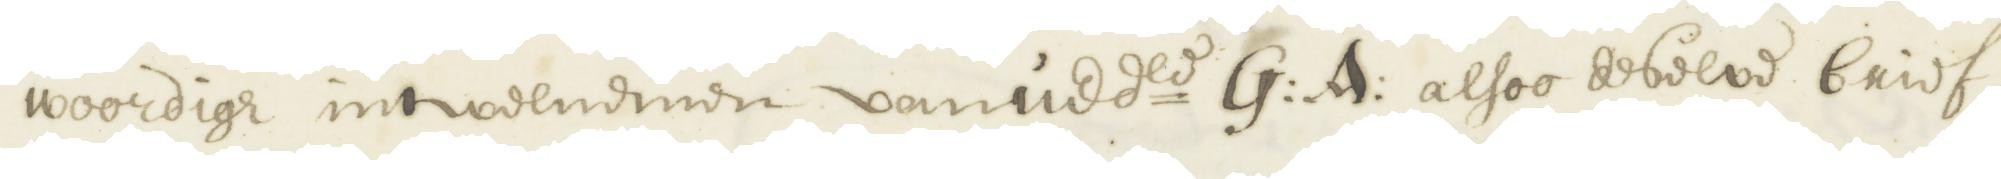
woordigh int welnemen van uEd=le G:A: alsoo deselve brief
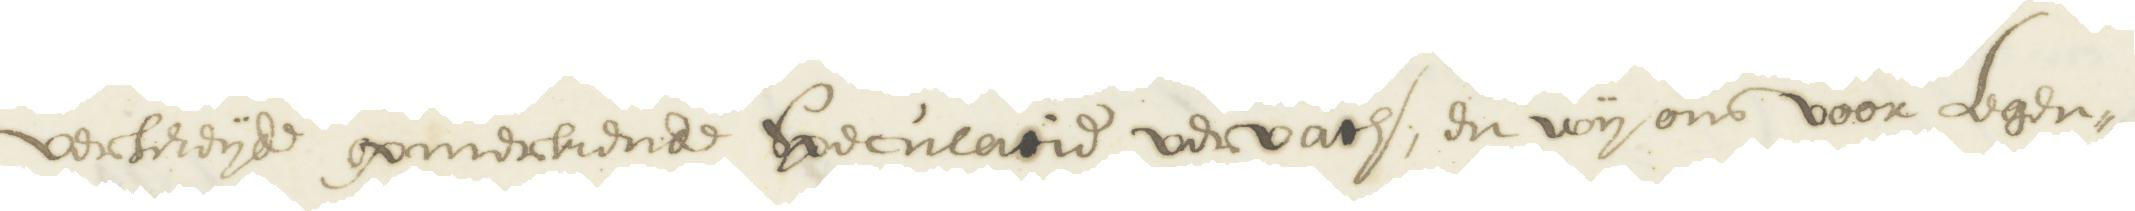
verscheijde opmerkende speculatie vervath; en wij ons voor tegen„
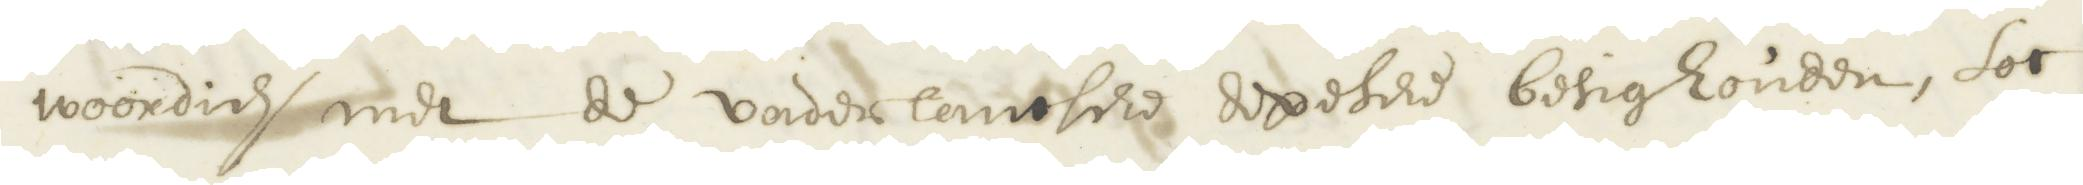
woordich met de vaderlantsche depesche besighouden, tot
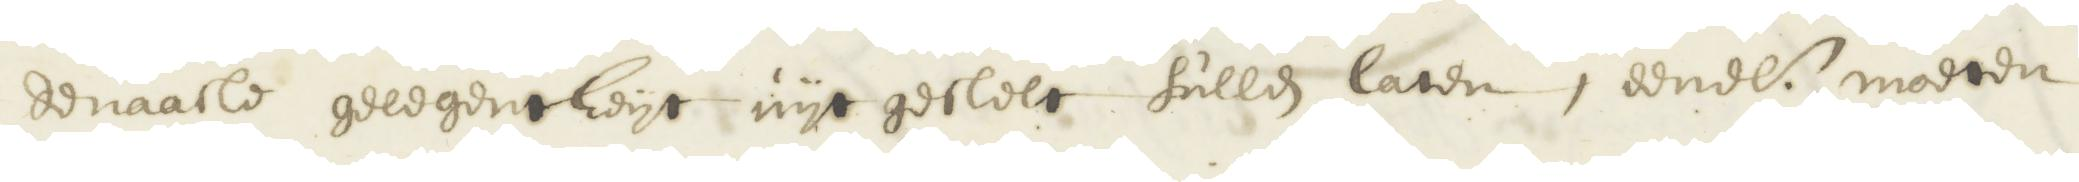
denaaste gelegentheijt uijt gestelt sullen laten, eenelijk moeten
